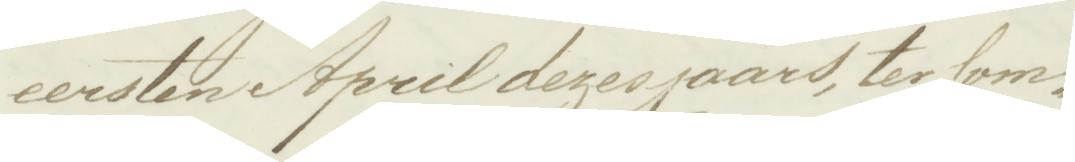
eersten April dezes jaars, ter som„
